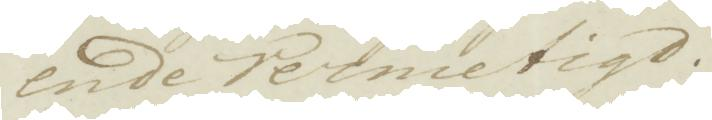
ende vernietigd.
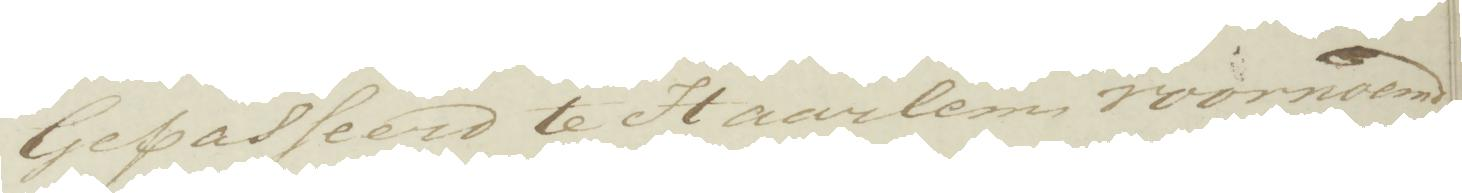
Gepasseerd te Haarlem, voornoemd
